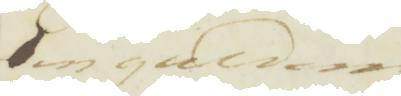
Een guldens
